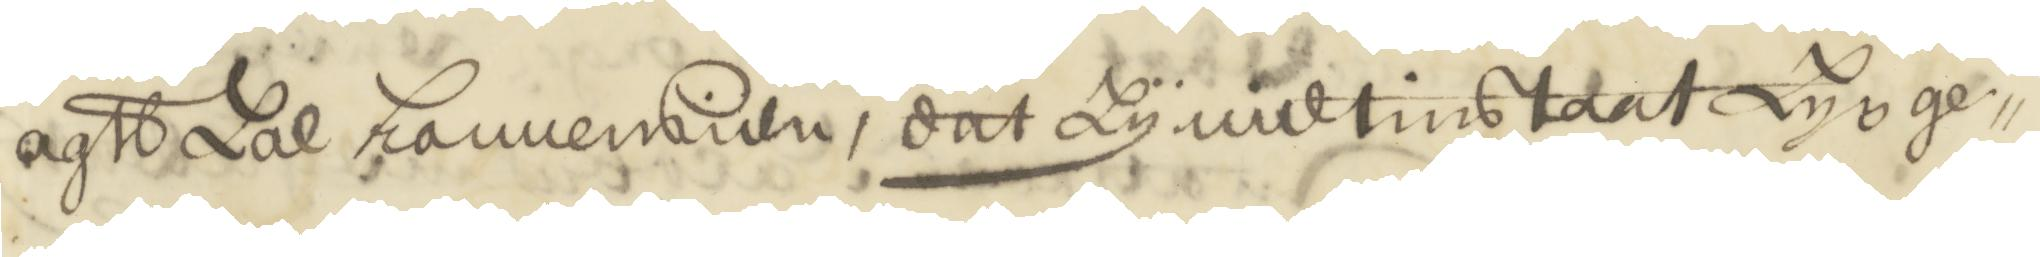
agtb Zal konnen sien, dat Zij niet instaat Zyn ge„
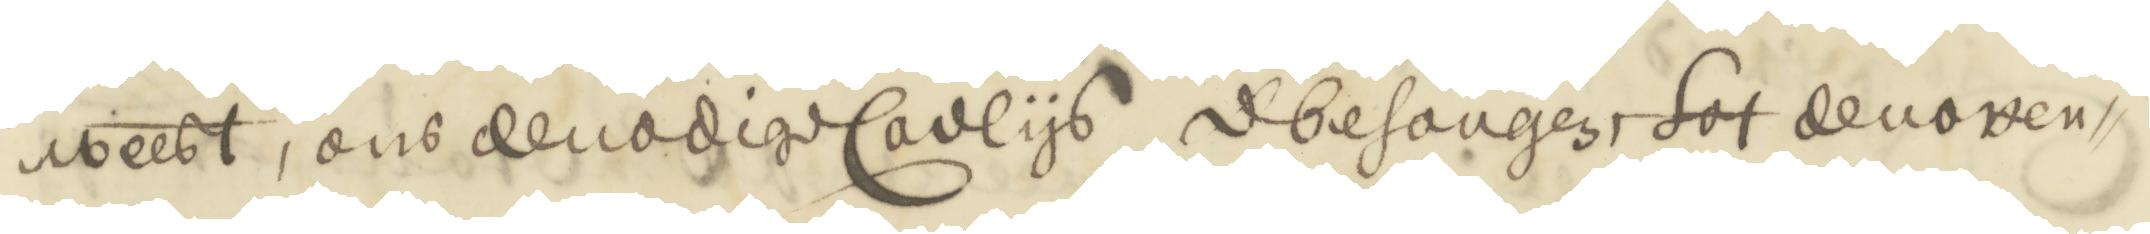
weest, ons de nodige Coelijs te besorgen, tot den over„
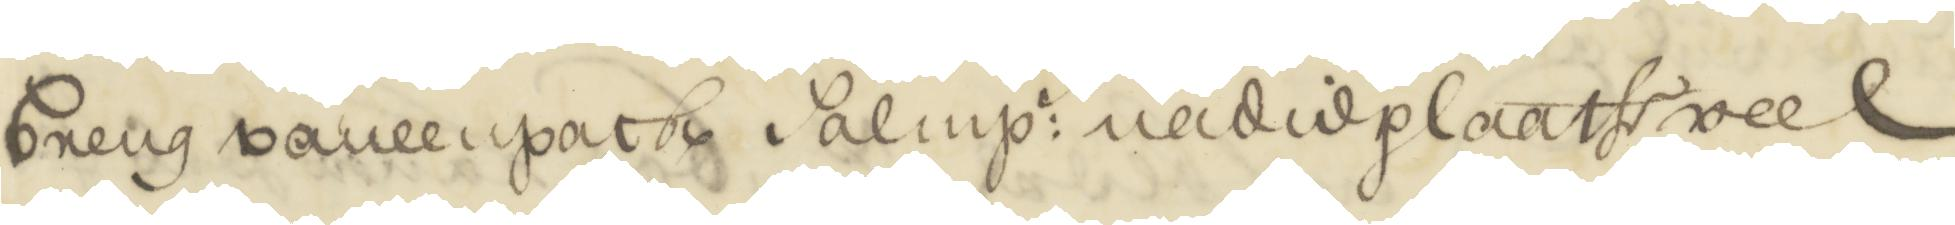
breng van een pack Salmp:s na die plaatse veel
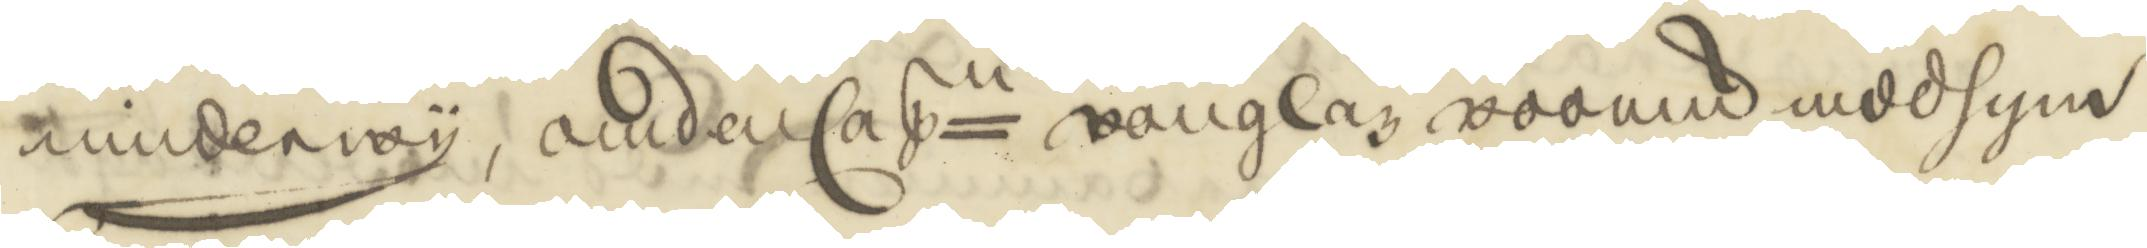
minder wij, omden Cap=n vanglan voorm' med syne
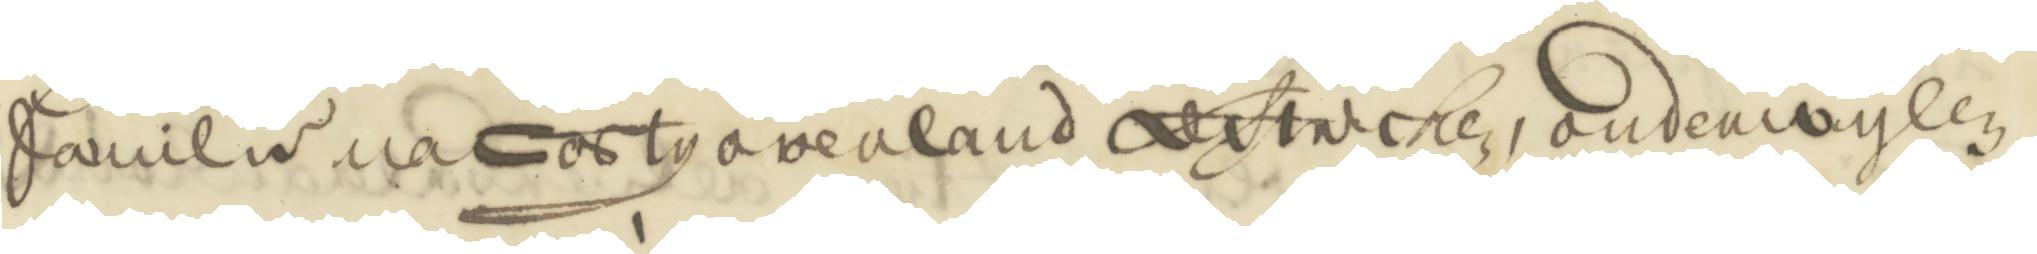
familie na Costy overland te vertrecken, onderwijlen
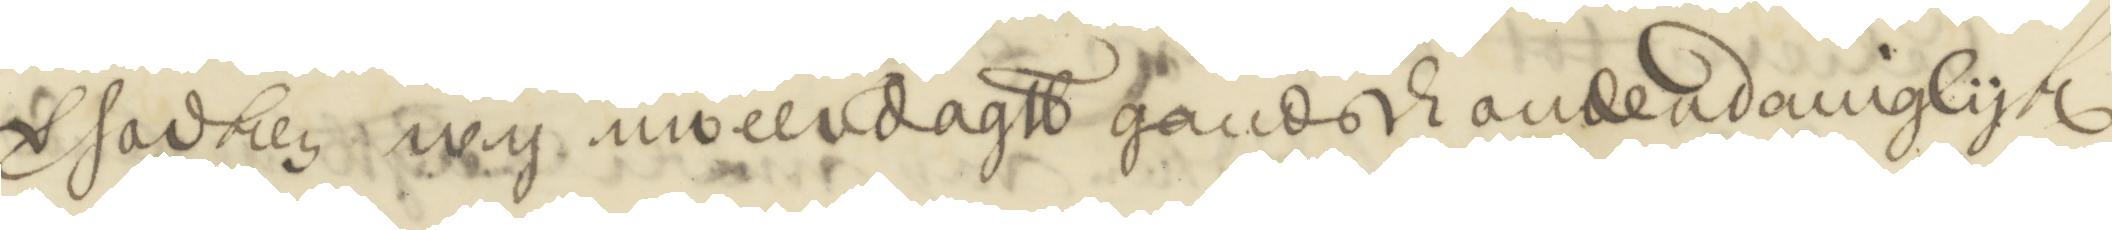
versoeken wy uwel Edagtb gandsch onderdaniglijk
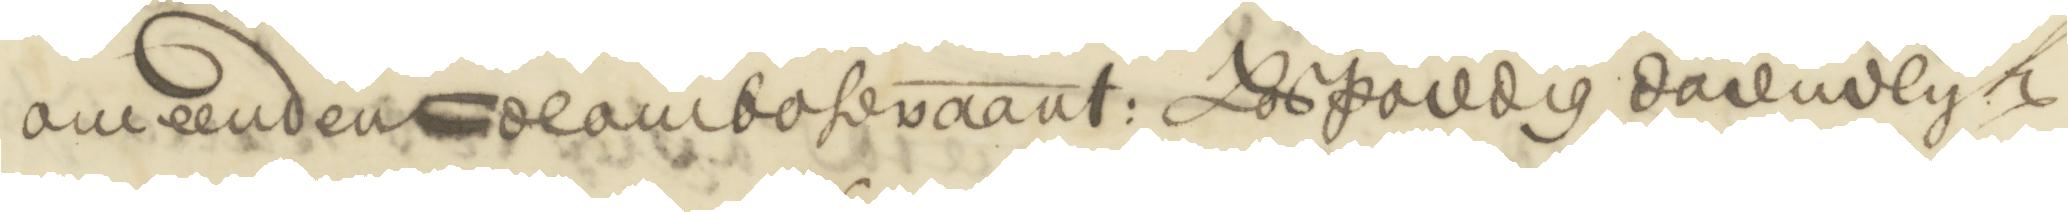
om eerden Colombosevaart: Zo spoedig doenelyk
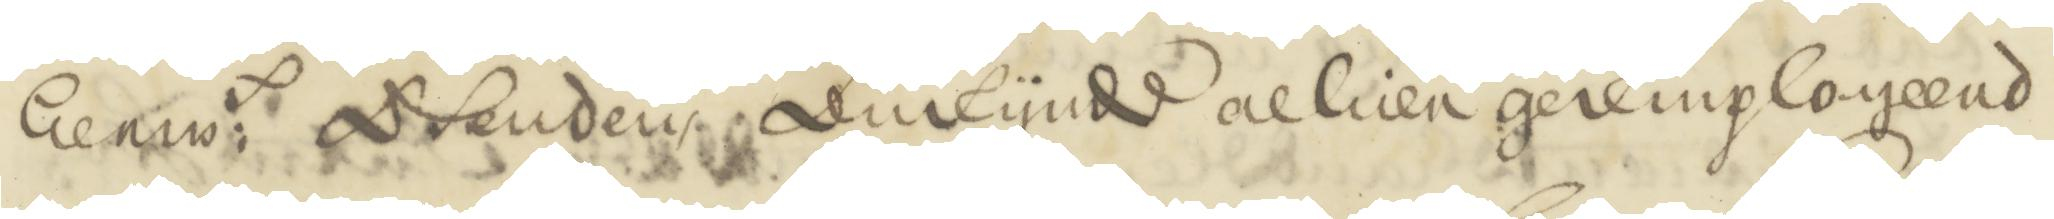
herw„s te Senden, ten Eijnde alhier geemployeerd
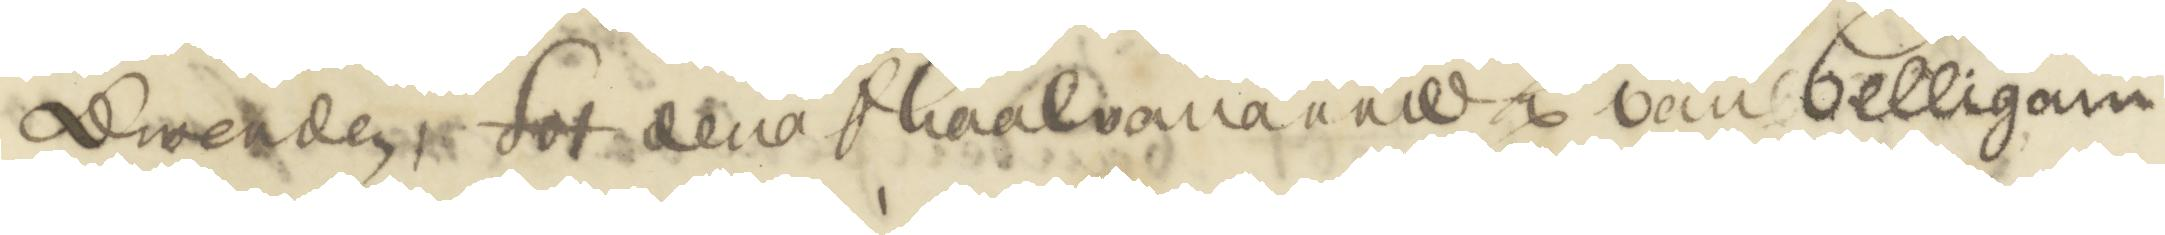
te werden, tot den afhaal vanarreek van belligam
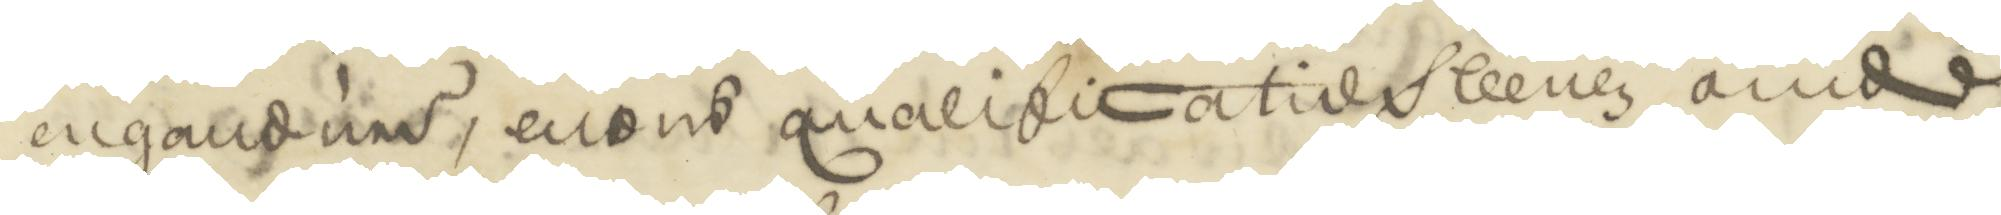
en gandure, en ons qualificatie verleenen omde
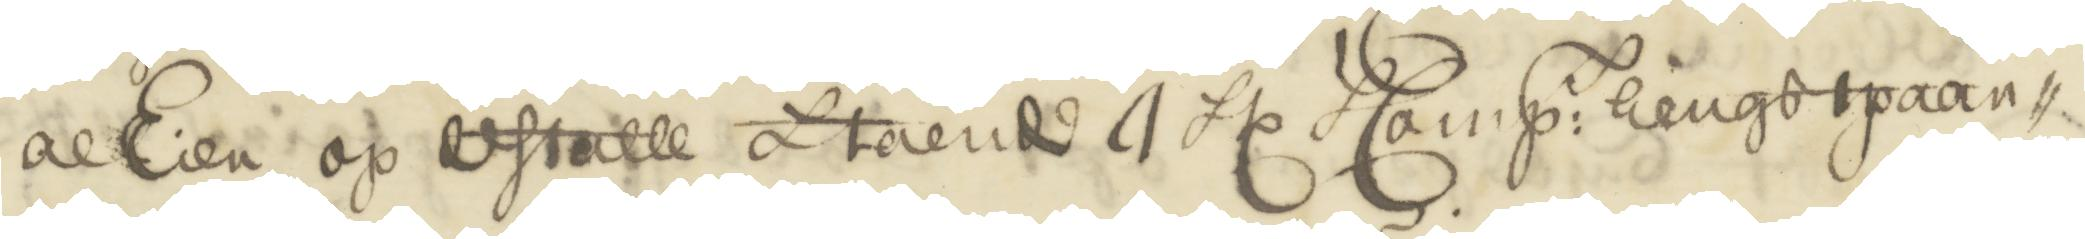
alhier op de stalle staende 4 stx SComp:s hengstpaar„
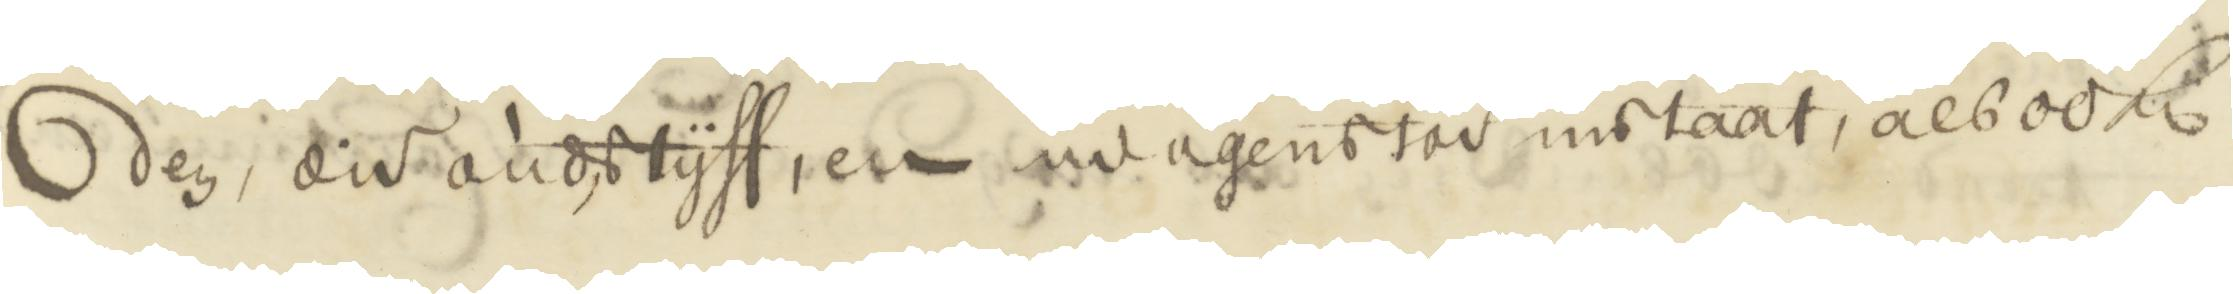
den, die oud,stijff,en nergens toe instaat, als ook
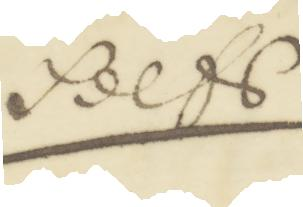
selfs
